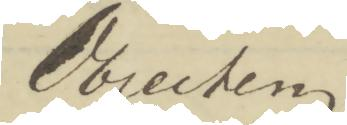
Objecten
